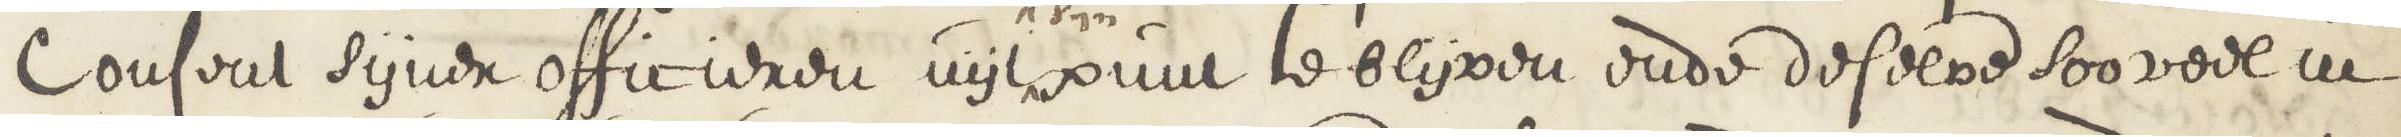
Consent sijner officieren uijt„ punt te blijven ende deselve soo veel in
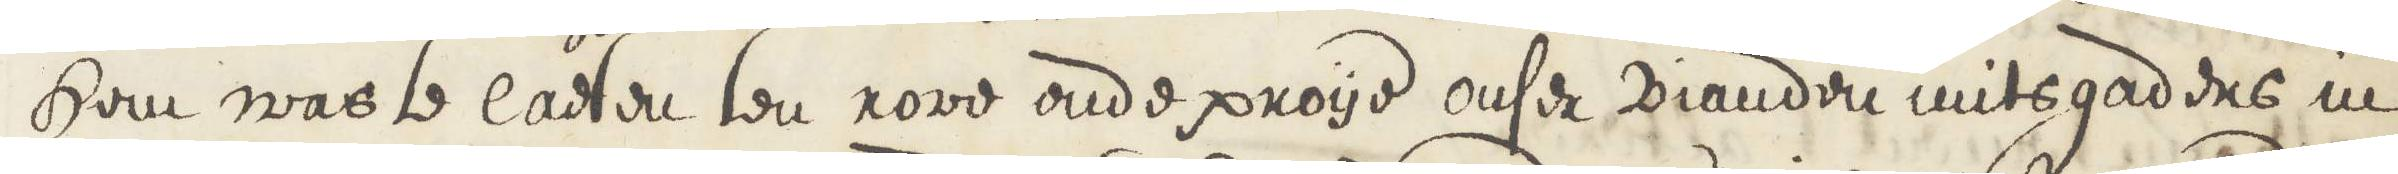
hem was te laeten ten rove ende proije onser vianden mitsgaders in
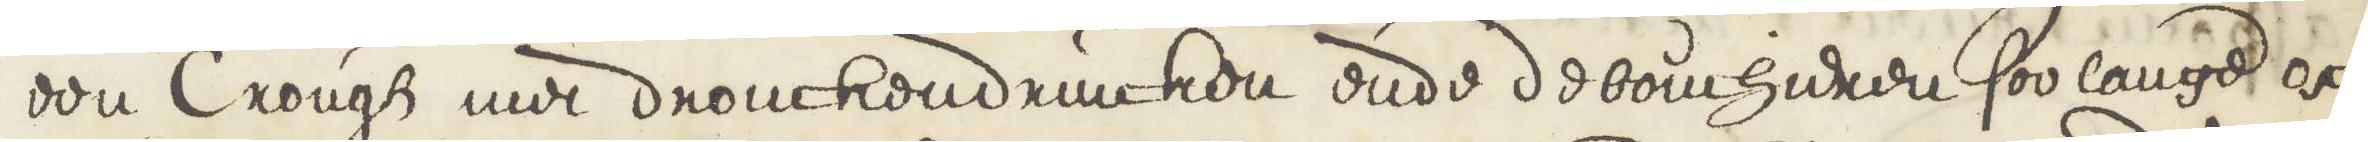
een Crough met dronckendrincken ende debouchieren soo lange op
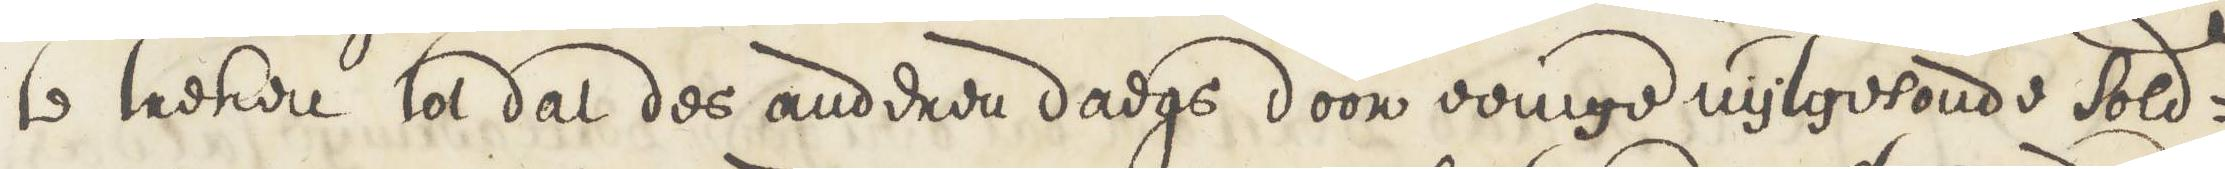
te treken tot dat des anderen daegs door eenige uijtgesonde sold
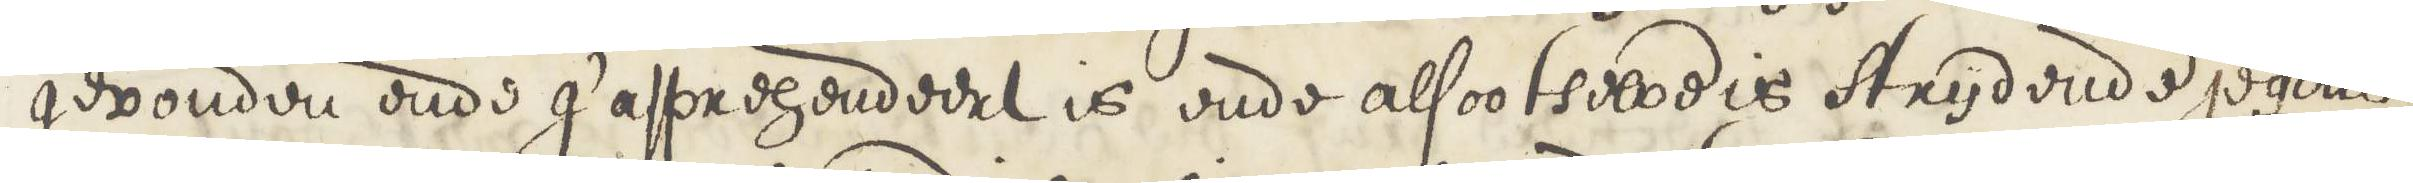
gevonden ende g’apprehendeert is ende alsoo 'tselve is strijdende jegens
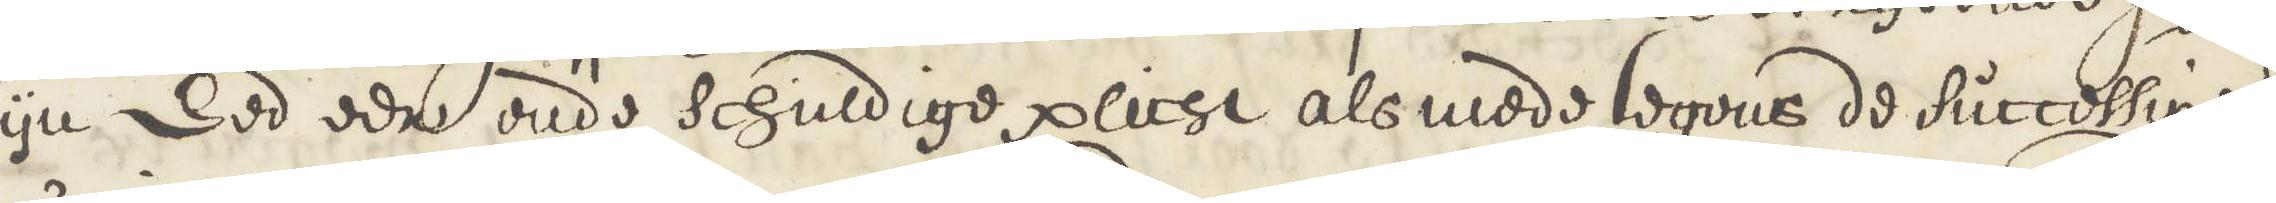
sijn Eed een ende schuldige plicht als mede tegens de successive
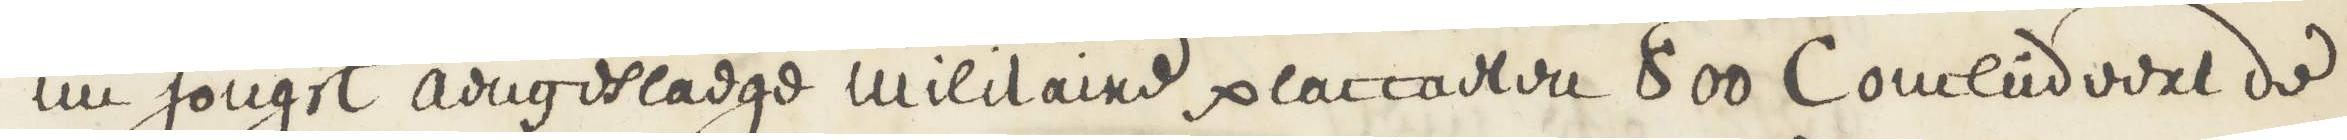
nu jongst aengeslaege militaire placcaeten soo Concludeert de
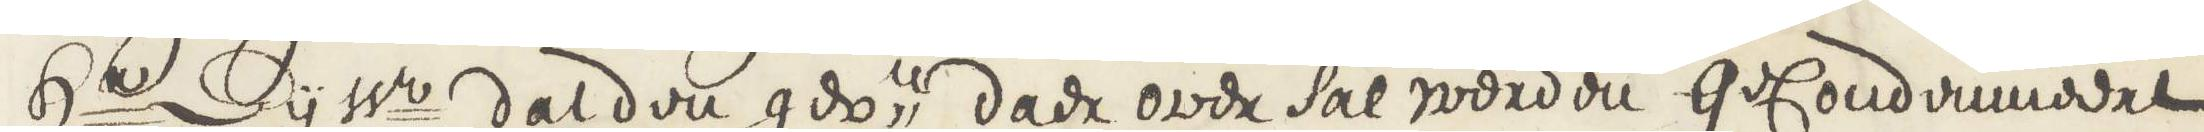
H=r Eijss=r dat den gev„n daer over sal werden gecondemneert
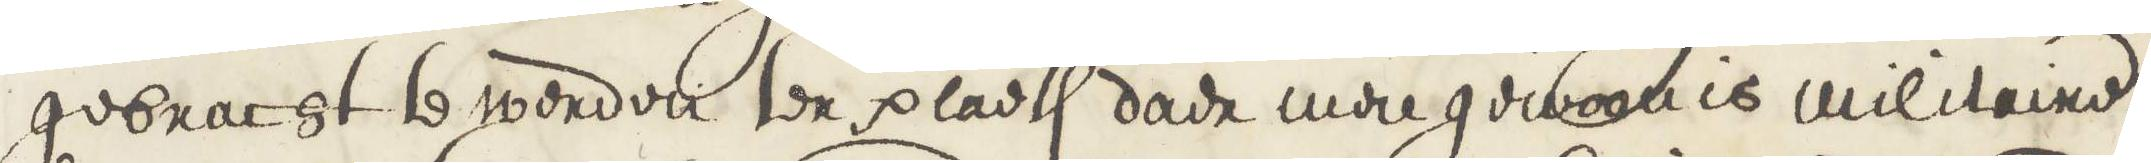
gebracht te werden ter plaets daer men gewoon is militaire
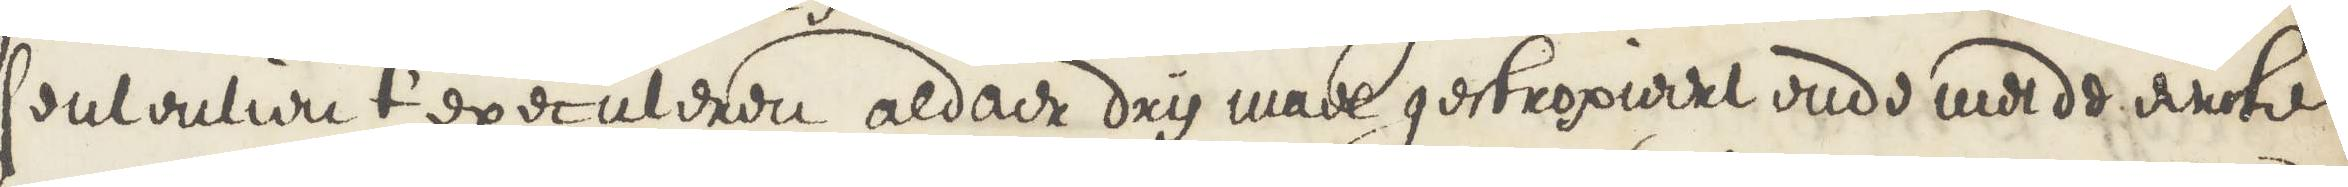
sententien t'executeren aldaer drij mael gestropieert ende met de eerste
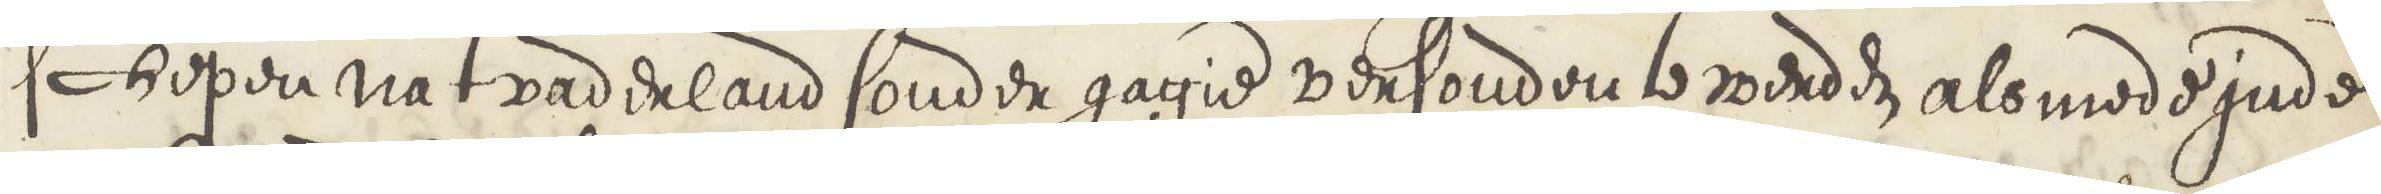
schepen na 't vaderland sonder gagie versonden te werden als mede inde
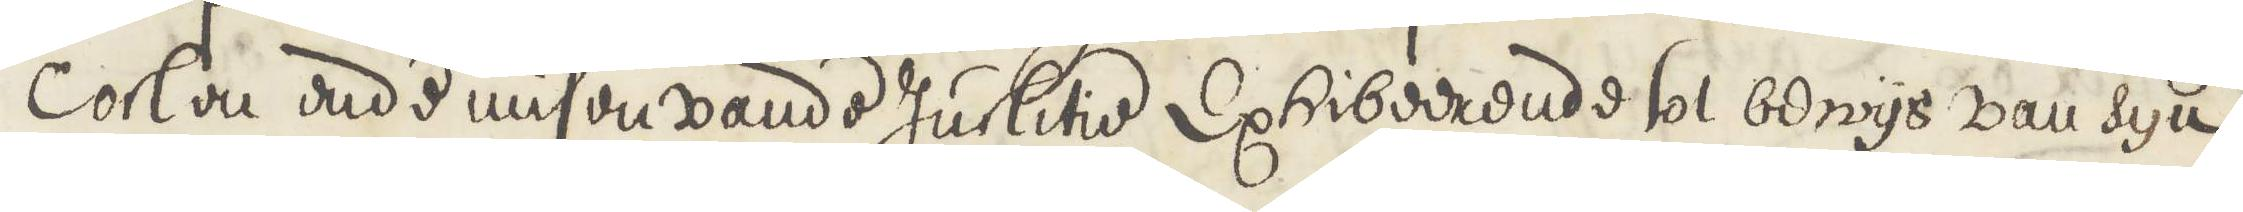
Costen ende misen vande Justitie Exhibeerende tot bewijs van sijn
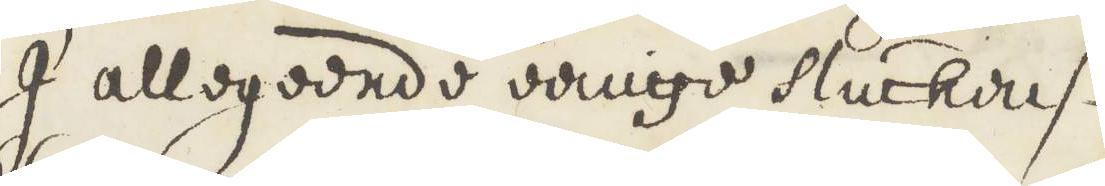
g' allegeerde eenige stucken/
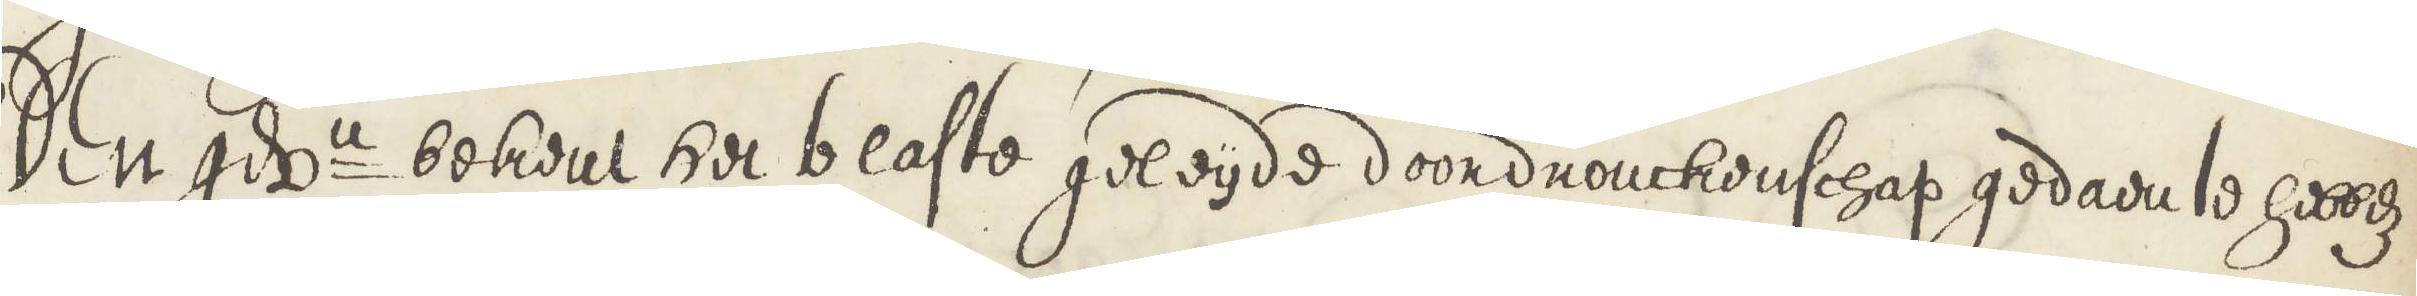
Den gev=n bekent het te laste geleijde door dronckenschap gedaen te hebben
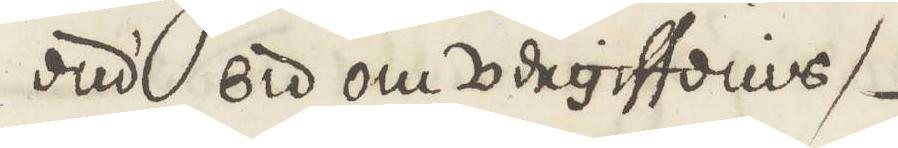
end' bid om vergiffenis/
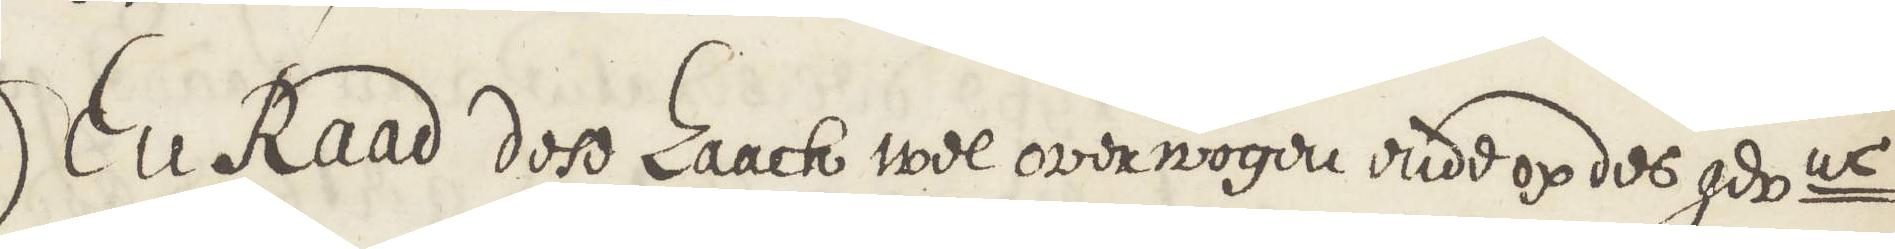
Den Raad dese zaack wel overwogen ende op des gev=ns
